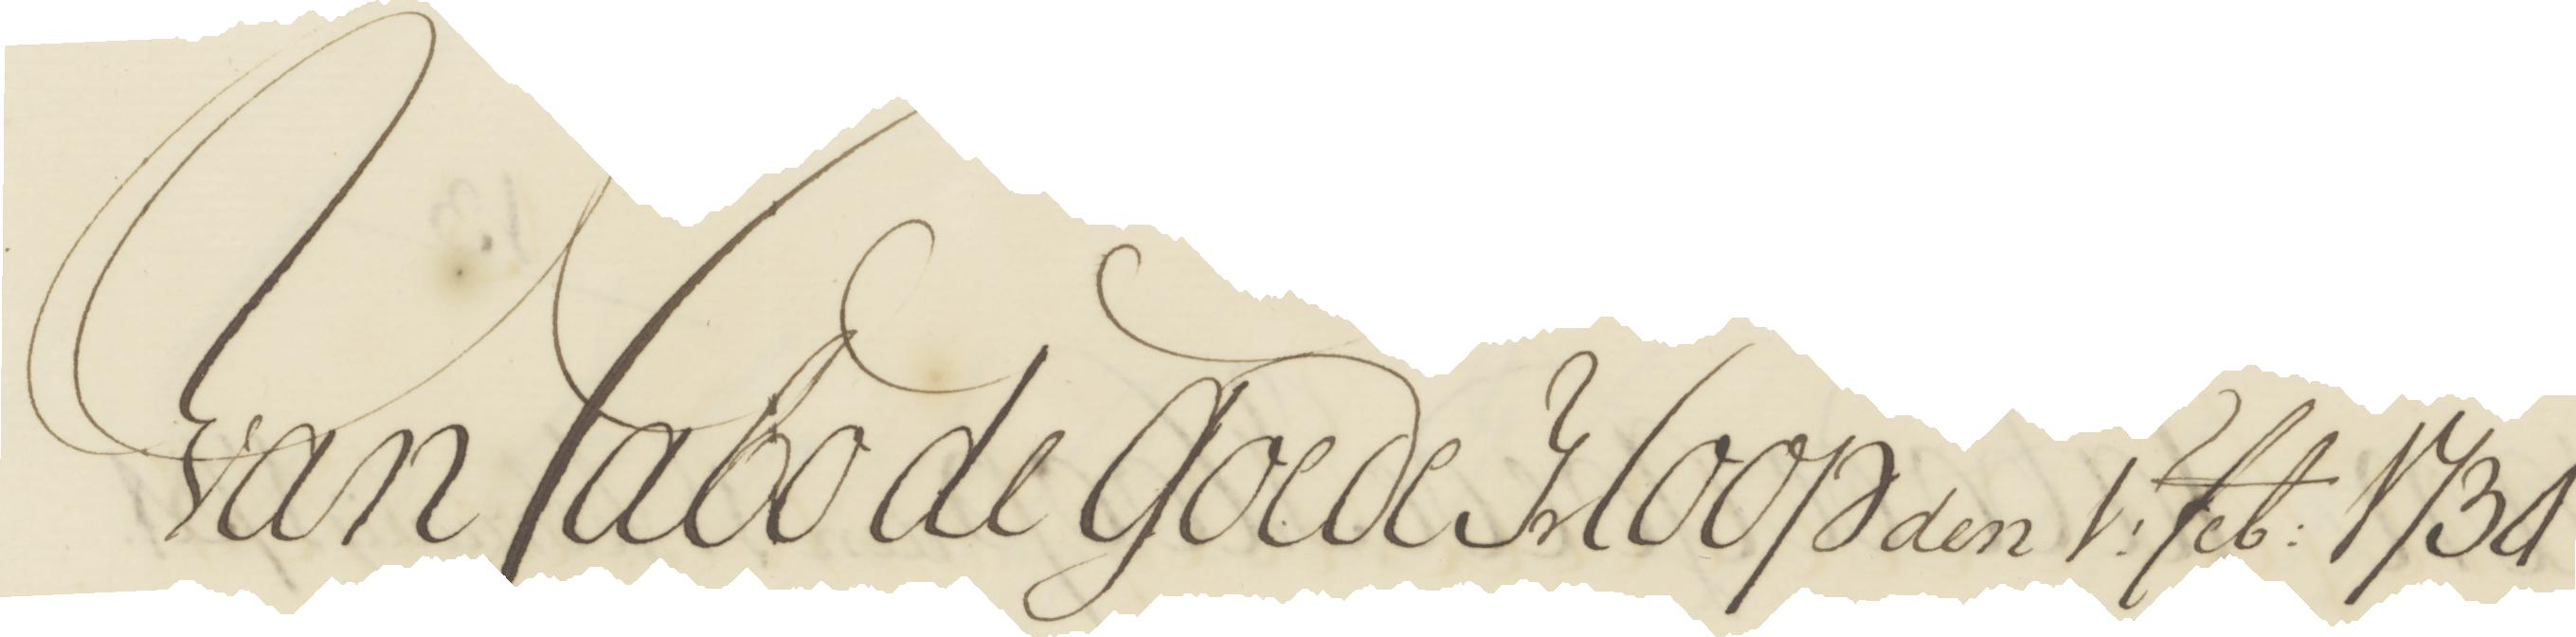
Van Cabo de Goede Hoop den 1:' feb: 1734
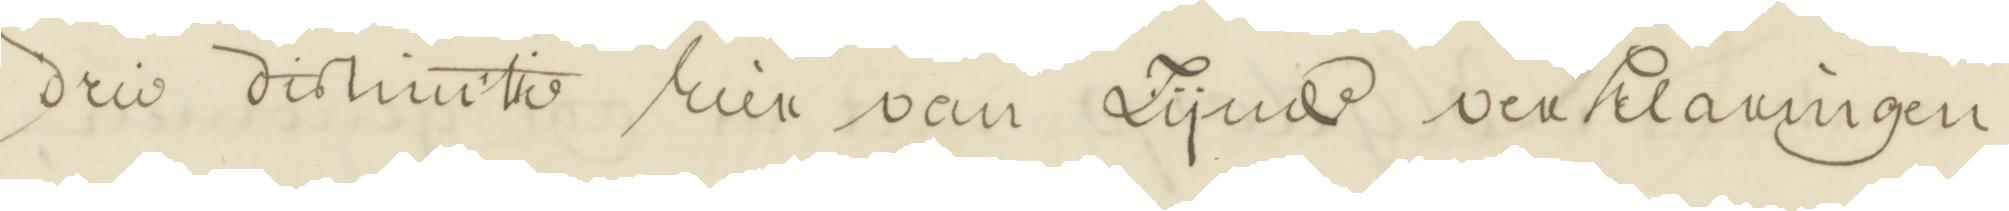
drie distinctie hier van zijnde verklaringen
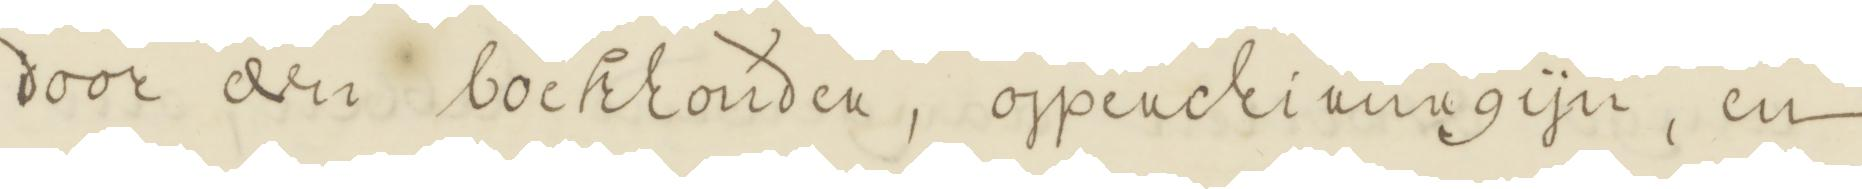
door den boekhouder, opperchirurgijn, en
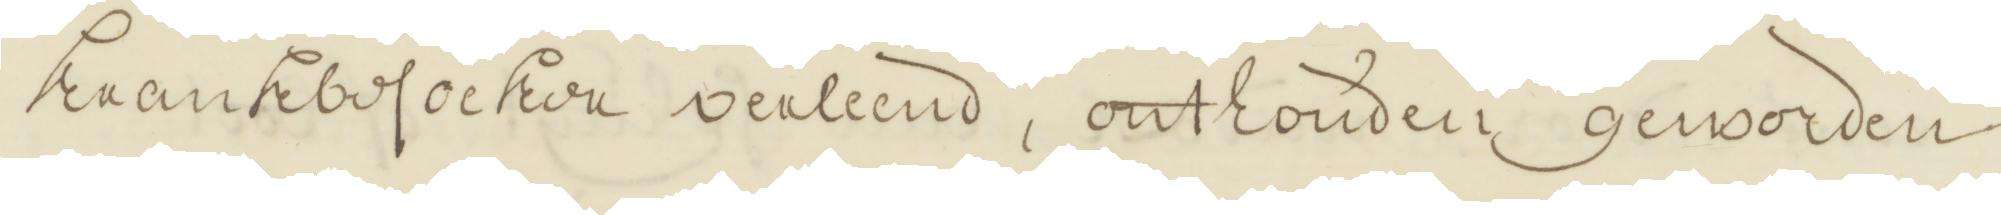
krankbesoeker verleend, onthouden geworden
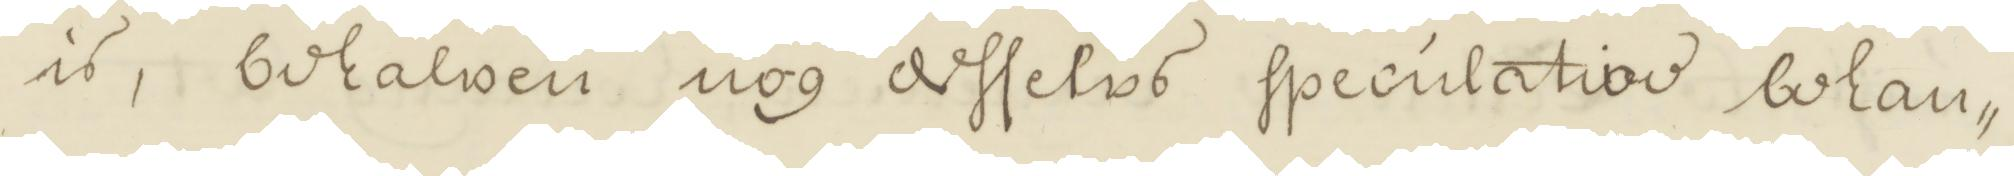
is, behalven nog desselvs speculative behan„
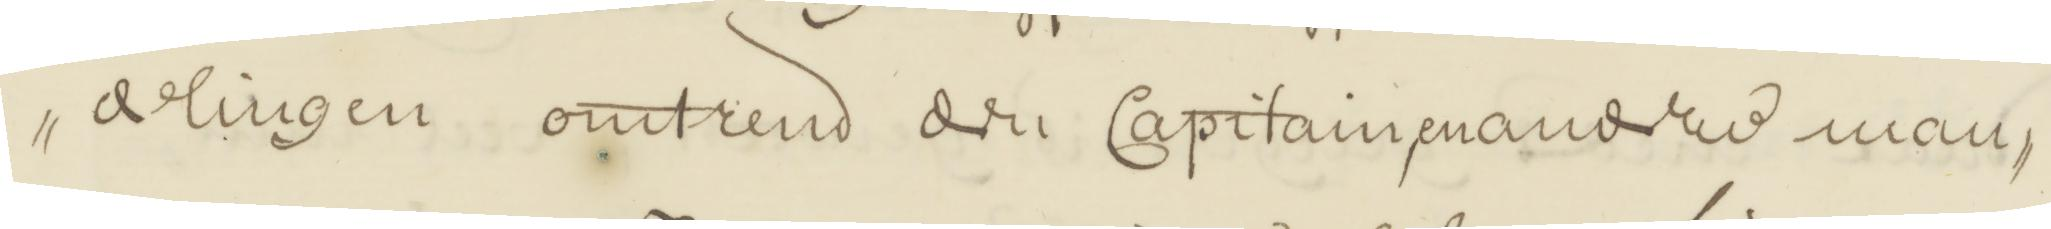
„delingen omtrend den Capitain, en andere man„
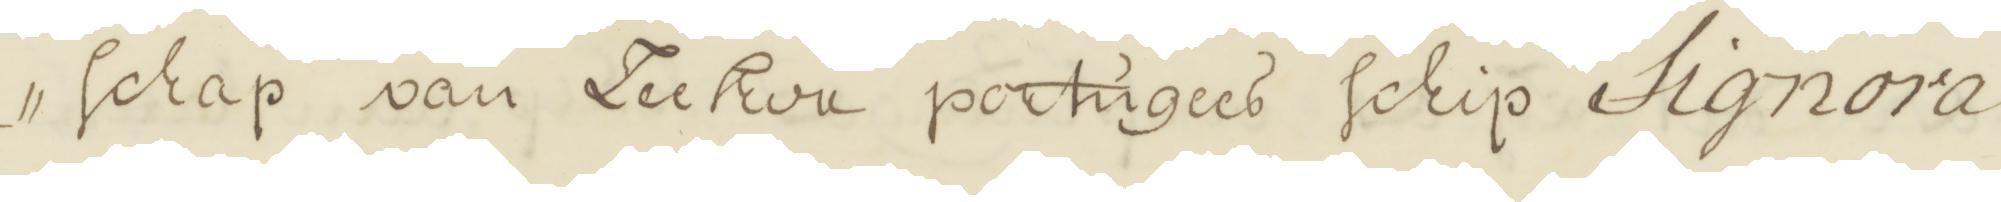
„schap van zeeker portugees schip Signora
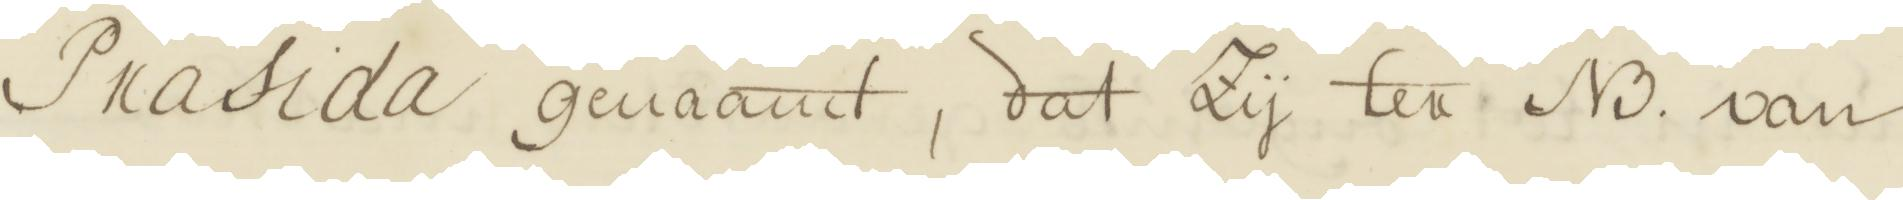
Prasida genaamt, dat zij ter NB. van
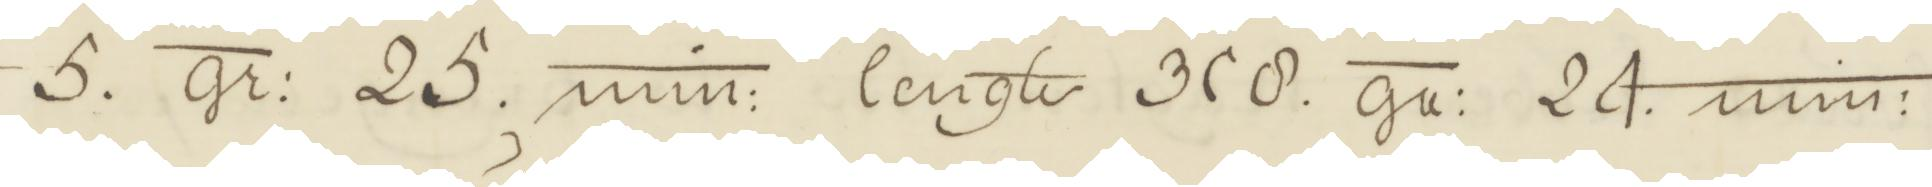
5. gr: 25. min: lengte 358. gr: 24. min:
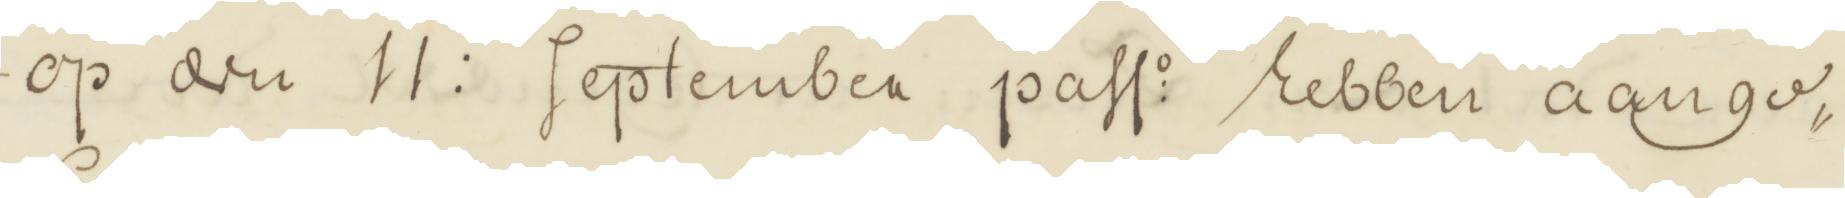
op den 11:' september pass:o hebben aan ge„
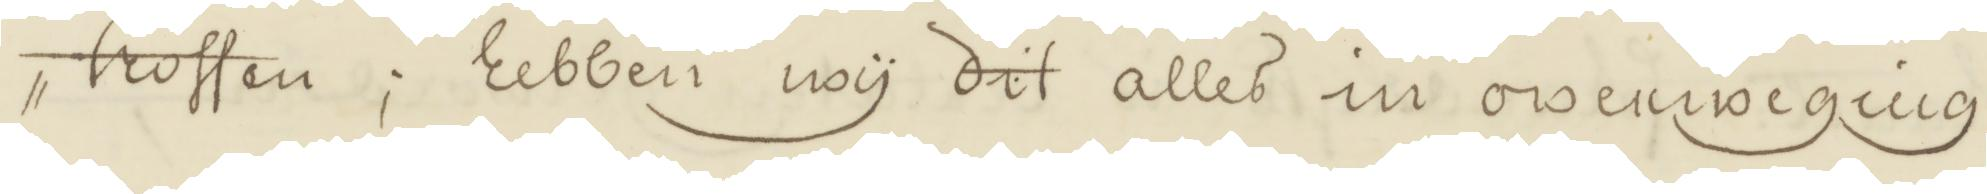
„troffen; hebben wij dit alles in overweging
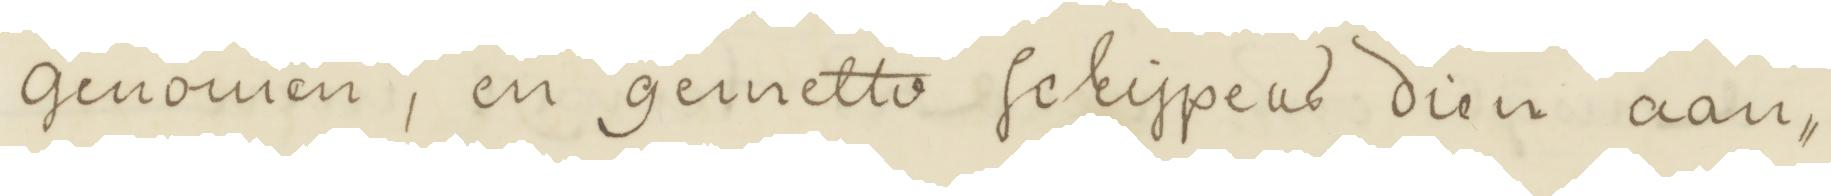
genomen, en gemelte schippers dien aan„
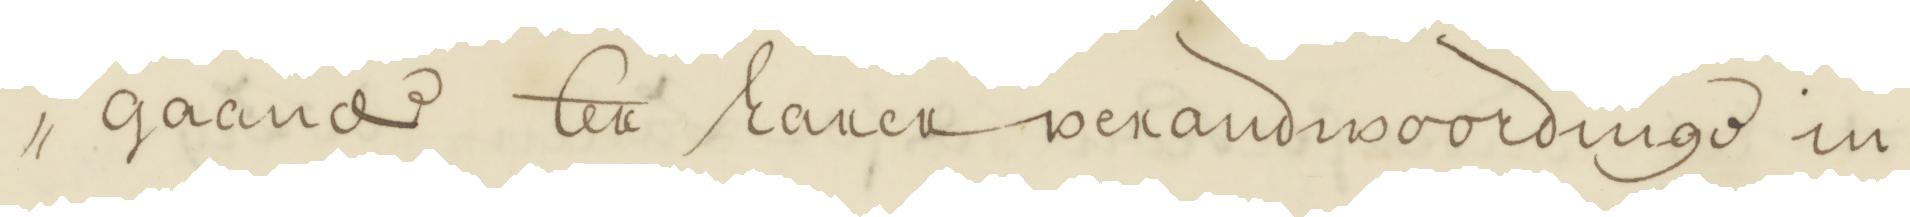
„gaande ter harer verandwoordinge in
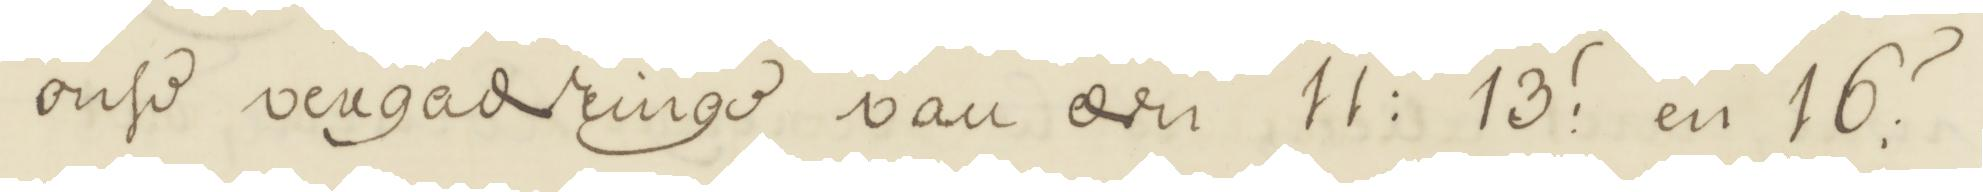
onse vergaderinge van den 11:' 13:' en 16:'
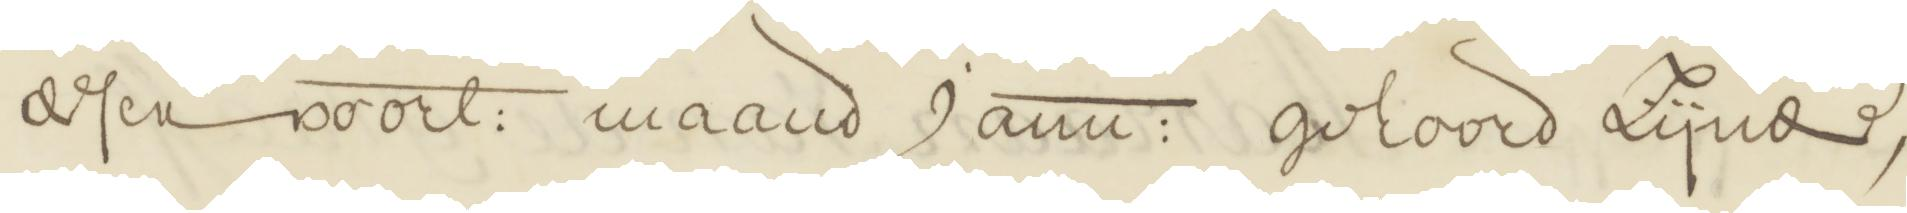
deser voorl: maand jann: gehoord zijnde
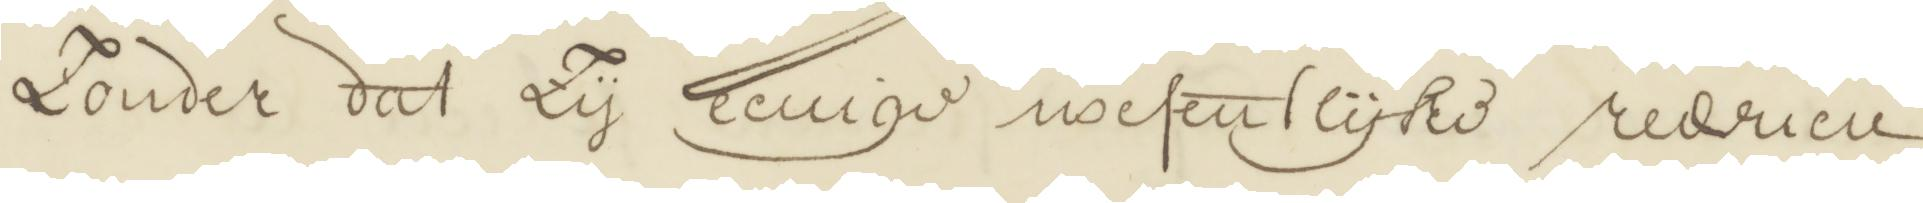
zonder dat zij eenige wesentlijke redenen
